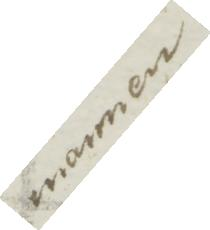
mannen
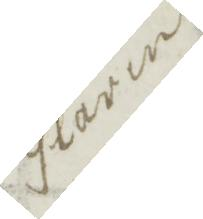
slavin
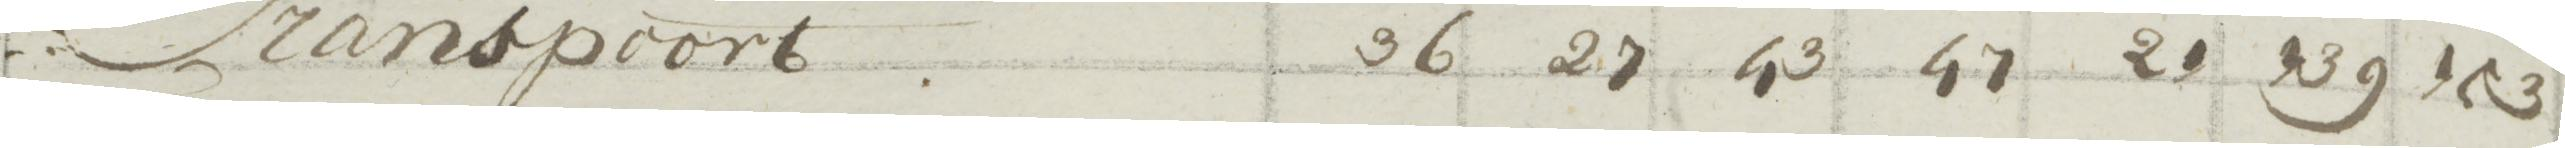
Transpoort 36 27 43 47 21 139 153
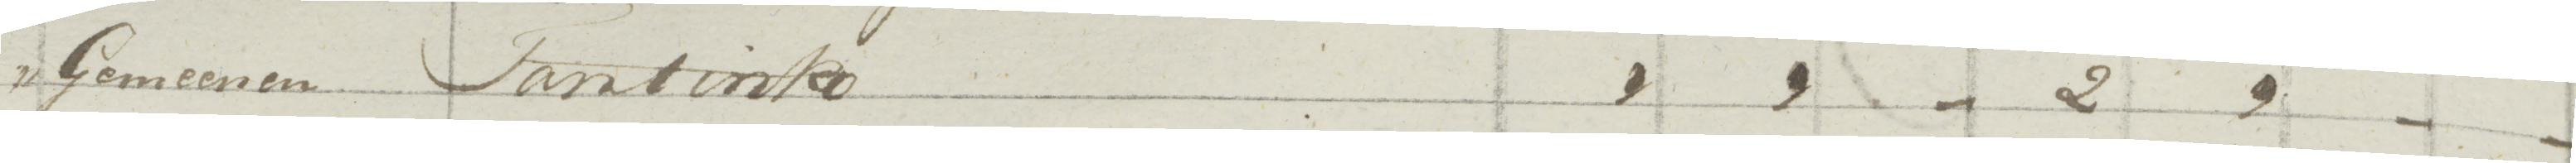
„ Gemeenen Tantinko 1 1 – 2 1 – –
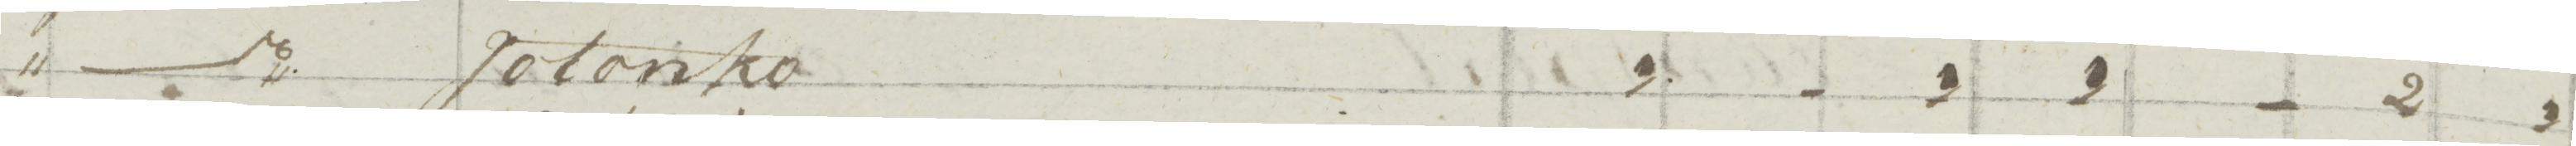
„ _„o Jotonko 1 – 1 1 – 2 1
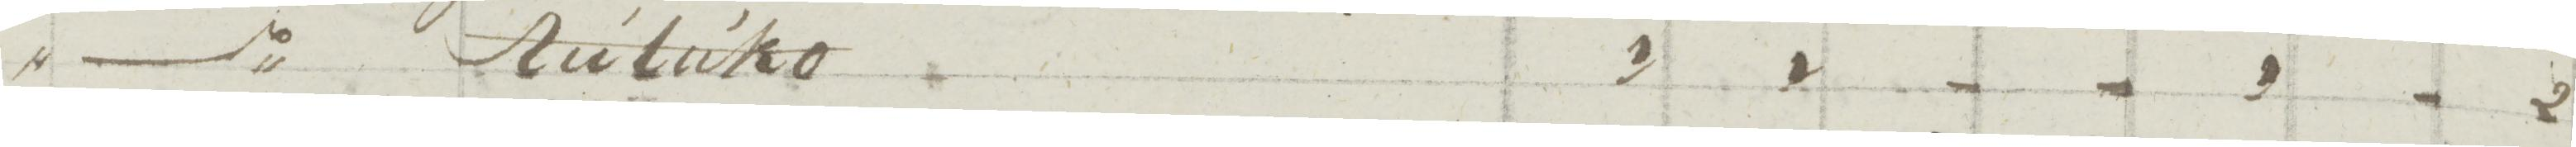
„ _„o Autuko 1 1 – – 1 – 2
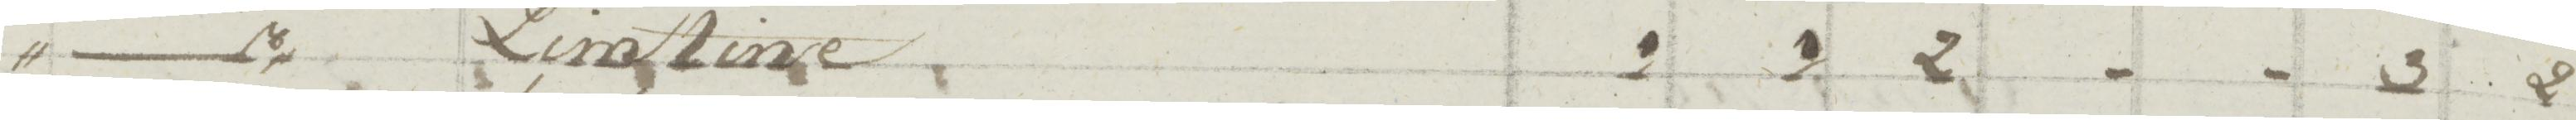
„ _„o Limtine 1 1 2 – – 3 2
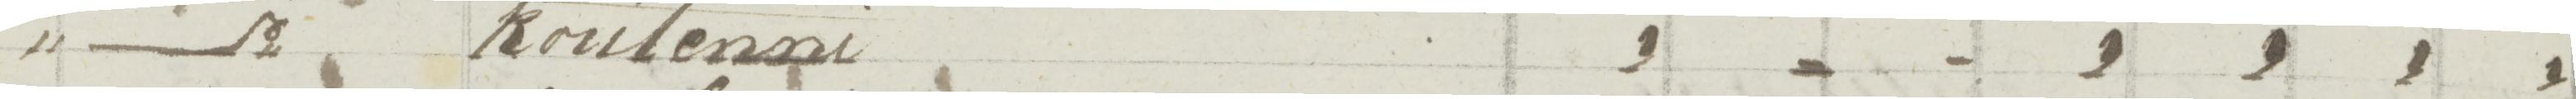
„ _„o Koulenni 1 – – 1 1 1 1
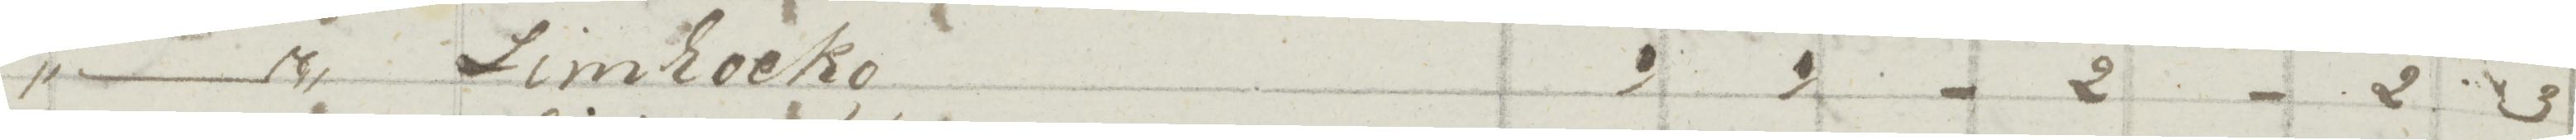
„ _„o Limhoeko 1 1 – 2 – 2 3
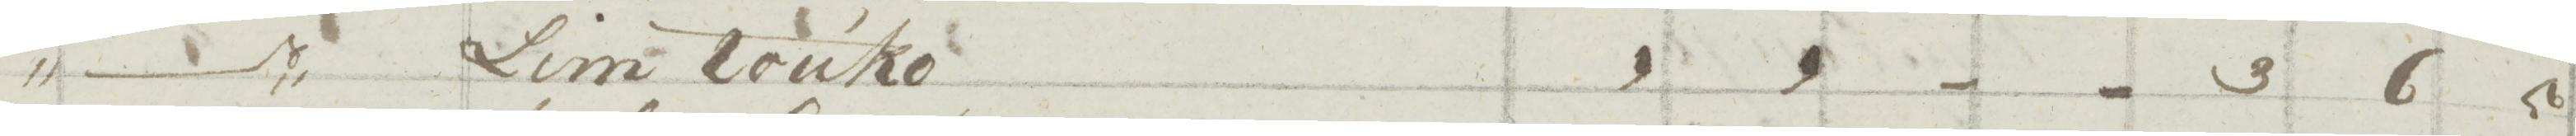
„ _„o Lim touko 1 1 – – 3 6 5
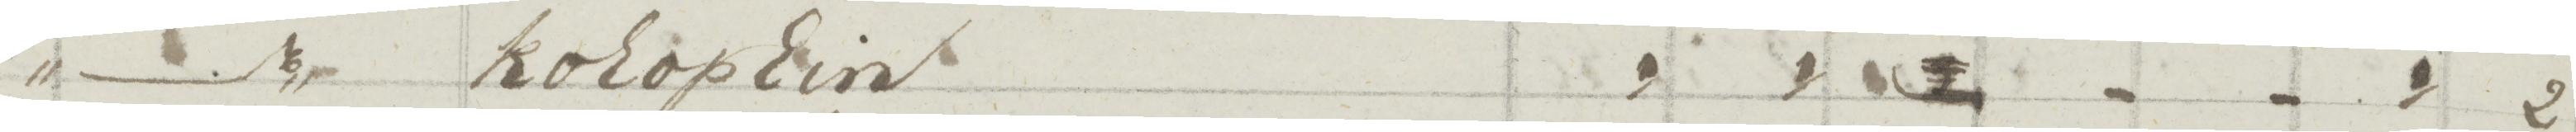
„ _„o kohop hin 1 1 – – – 1 2
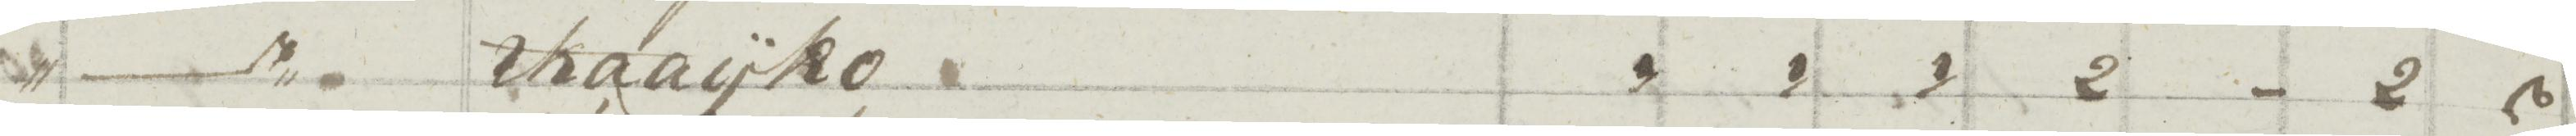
„ _„o thaaijko 1 1 1 2 – 2 5
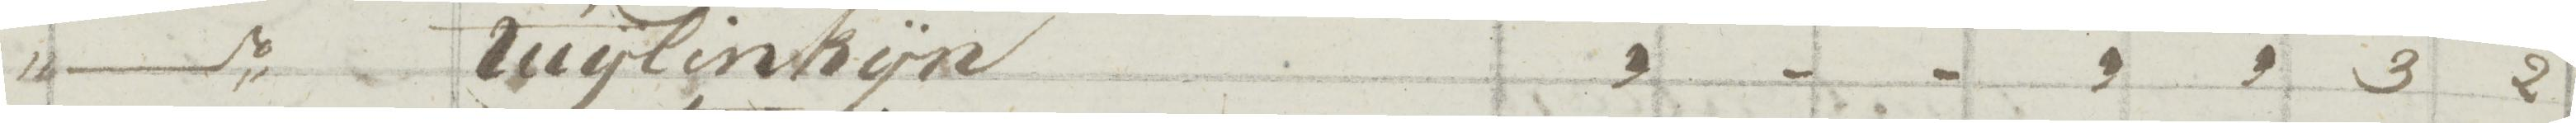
„ _„o tuijlinkijn 1 – – 1 1 3 2
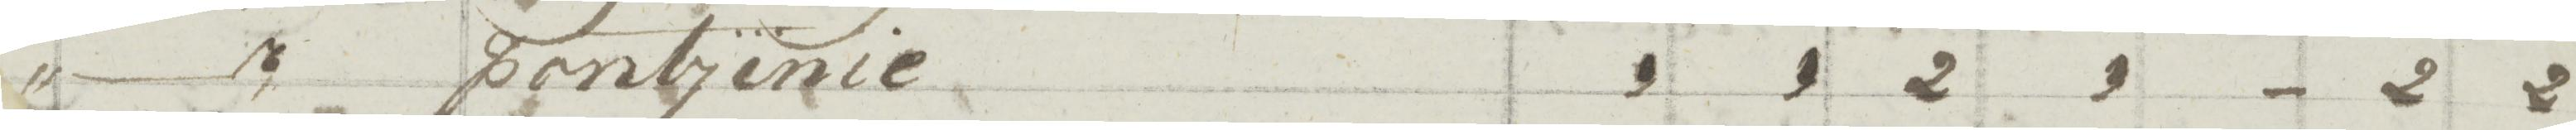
„ _„o pontjinie 1 1 2 1 – 2 2
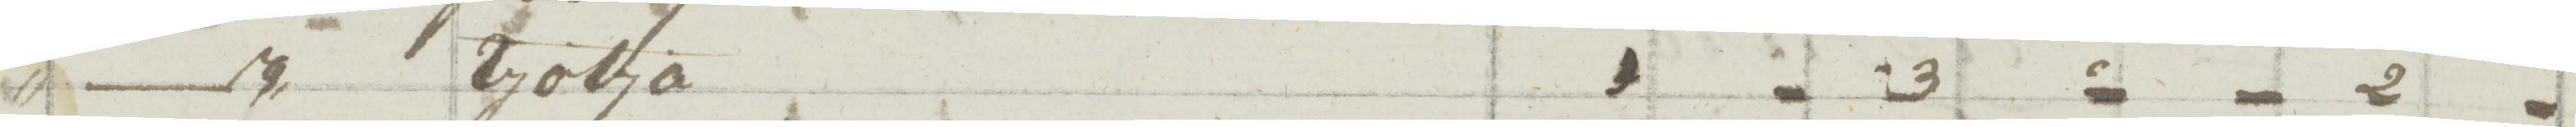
„ _„o tjotja 1 – 3 – – 2 –
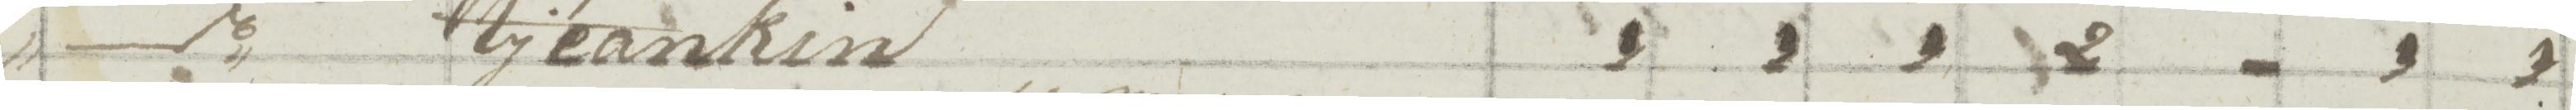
„ _„o tjeankin 1 1 1 2 – 1 1
